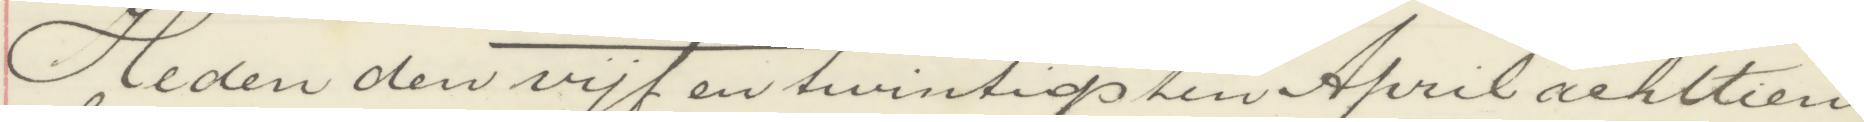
Heden den vijf en twintigsten April achttien
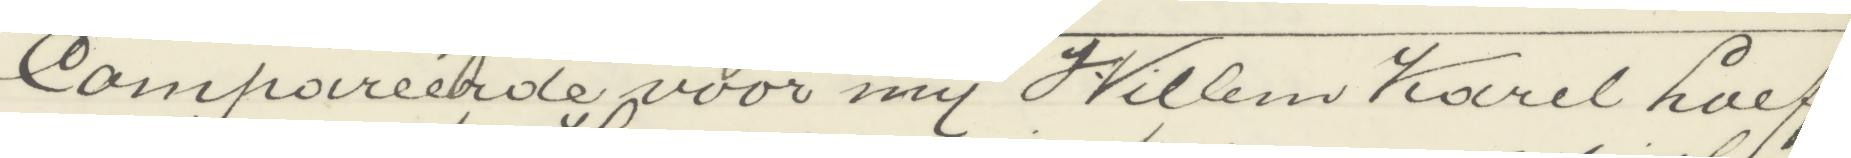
Compareerde voor my Willem Karel Loeff
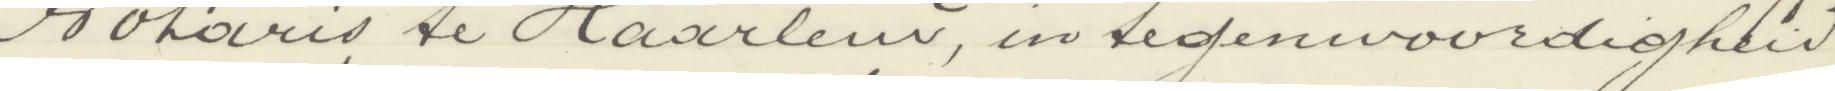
Notaris te Haarlem, in tegenwoordigheid
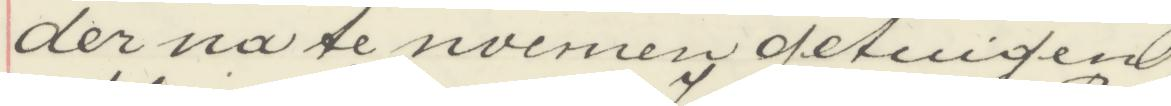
der na te noemen getuigen
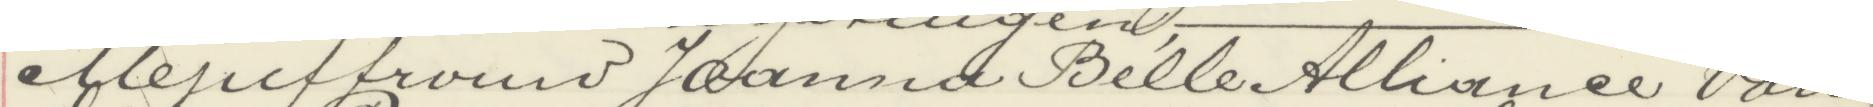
Mejuffrouw Joanna Belle Alliance van
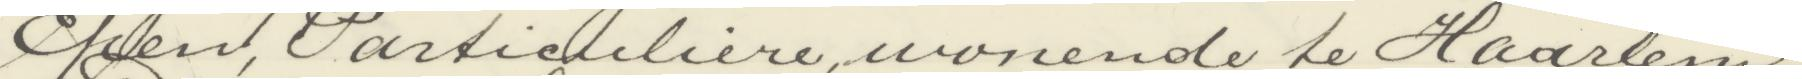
Epen, Particuliere, wonende te Haarlem,
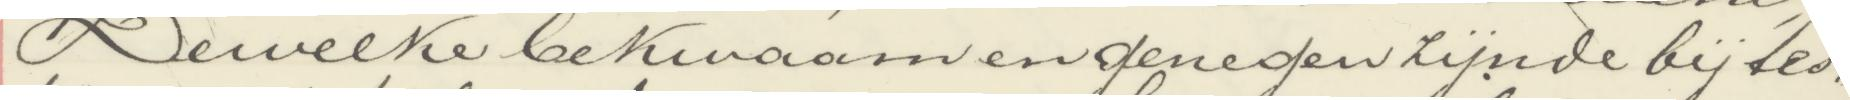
Dewelke bekwaam en genegen zijnde bij tes
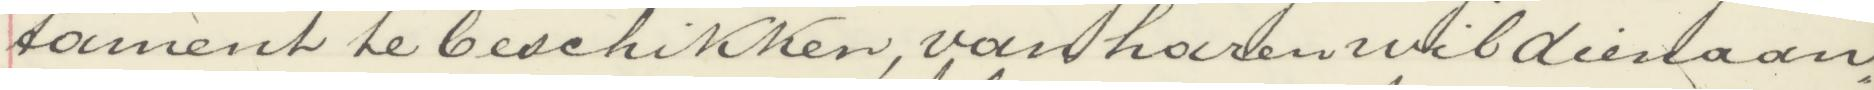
tament te beschikken, van haren wil dienaan
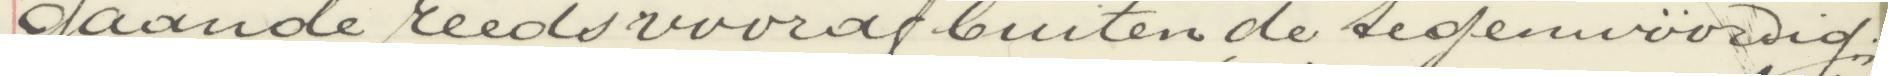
gaande reeds vooraf buiten de tegenwoordig„
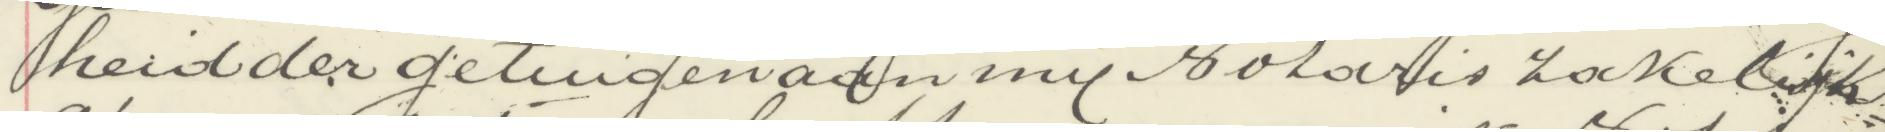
heid der getuigen aan mij Notaris zakelijk
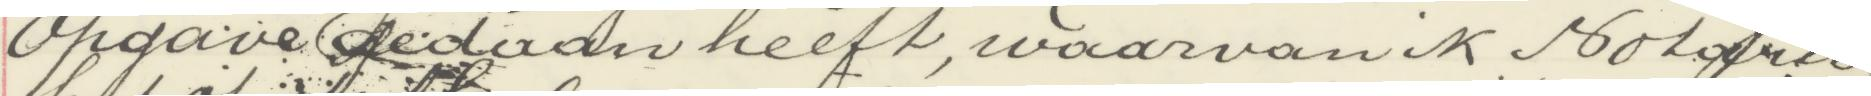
opgave gedaan heeft, waarvan ik Notaris
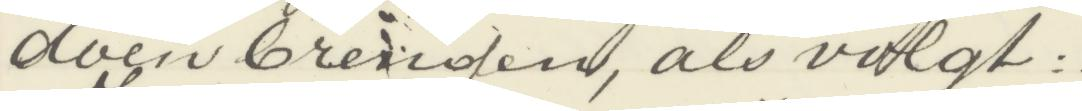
doen brengen, als volgt:
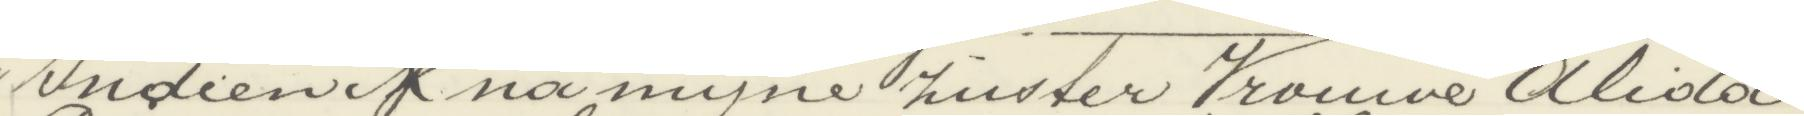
Indien ik na mijne zuster Vrouwe Alida
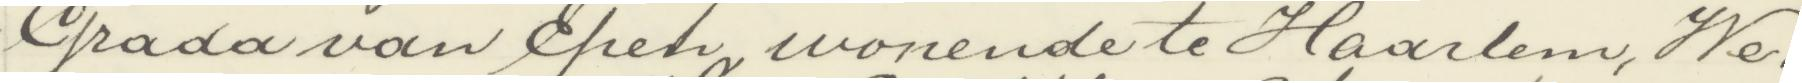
Grada van Epen, wonende te Haarlem, We„
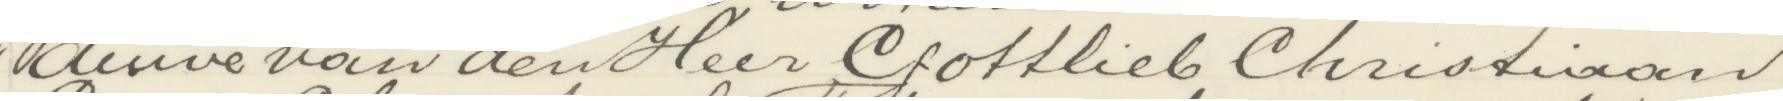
duwe van den Heer Gottlieb Christiaan
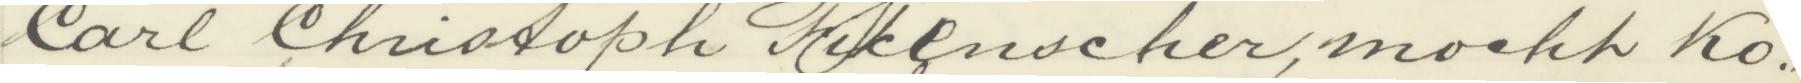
Carl Christoph Fikenscher, mocht ko„
